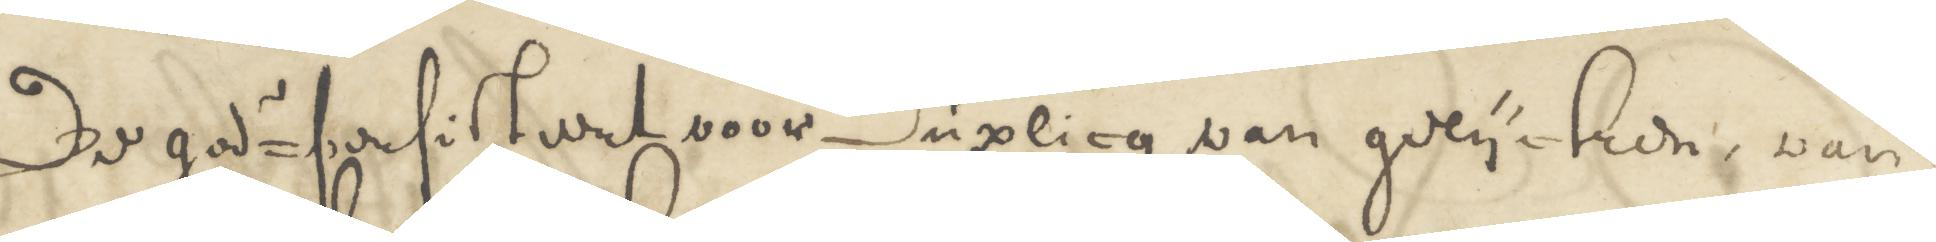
De ged=e persisteert voor Duplicq van gelijcken, van
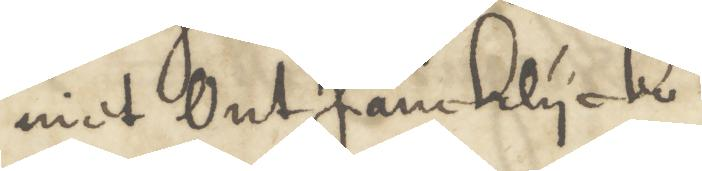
niet Ontfancklijck
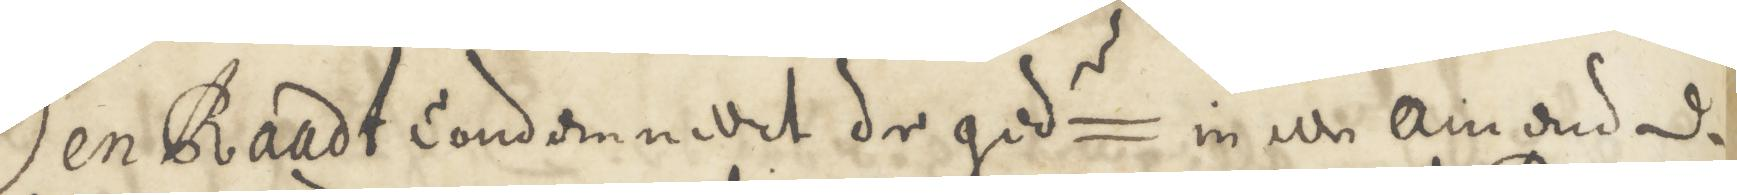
Den Raadt Condemneert de ged=e in een amende —
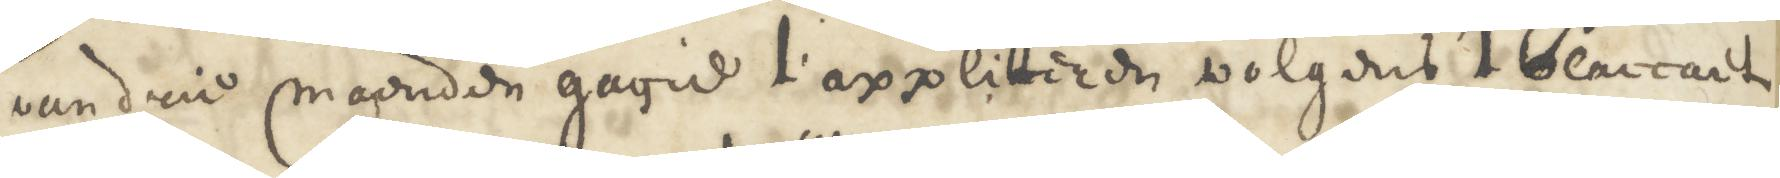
van drie maenden gagie t' appliceren volgens ’t Placcaet
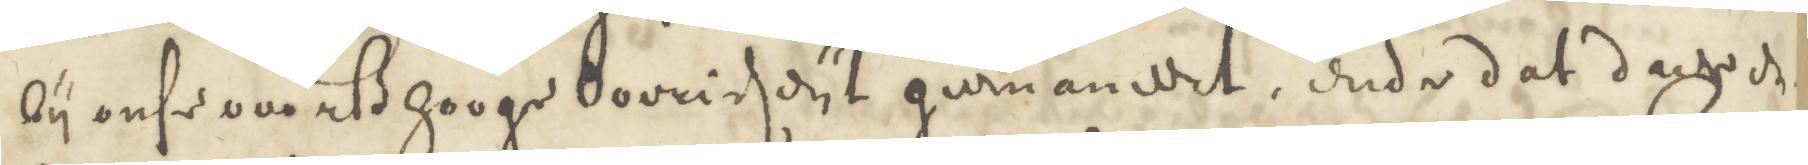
bij onse voors hooge Overicheijt geemaneert, ende dat daer en
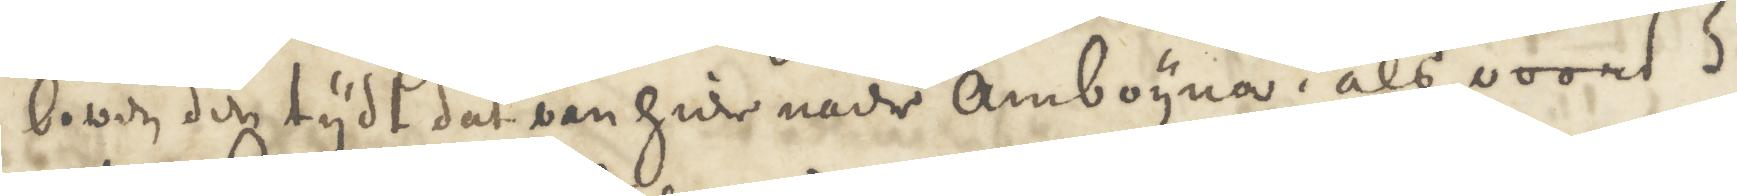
boven den tijdt dat van hier naer Amboijna, als voors
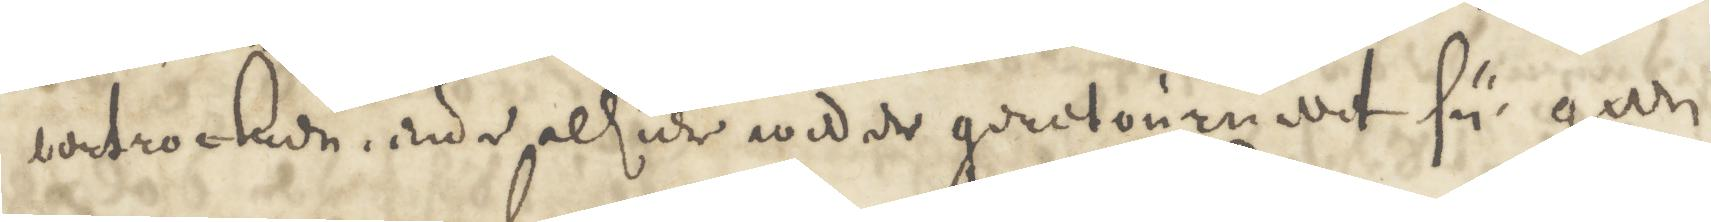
vertrocken, ende alhier weder geretourneert sij. geen
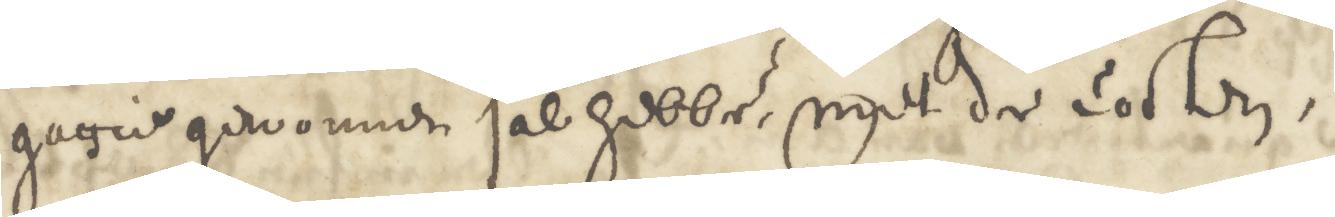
gagie gewonnen sal hebbe, met de Costen,
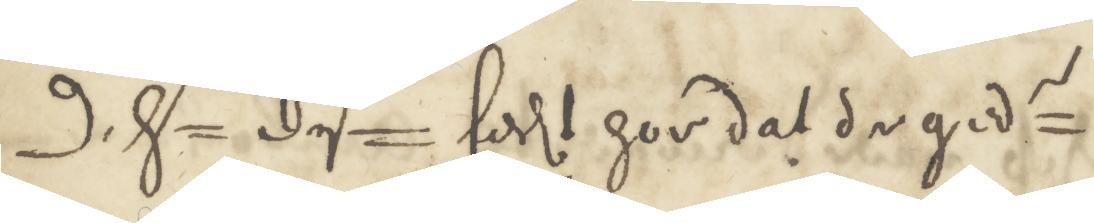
D. h=r Eij=r secht hoe dat de ged=e
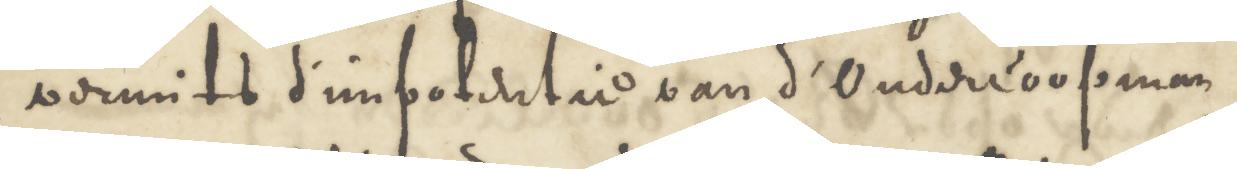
vermits d’inpotentie van d’Ondercoopman
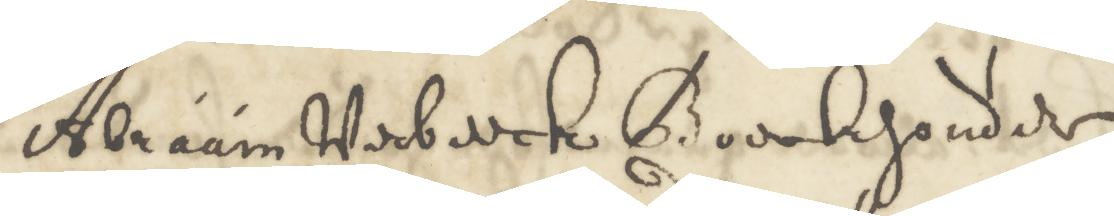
Abraam Verbeeck Boeckhouder
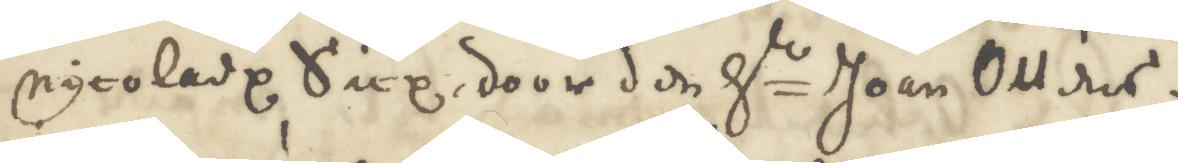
nicolaex Sicx, door den h=r Joan Ottens —
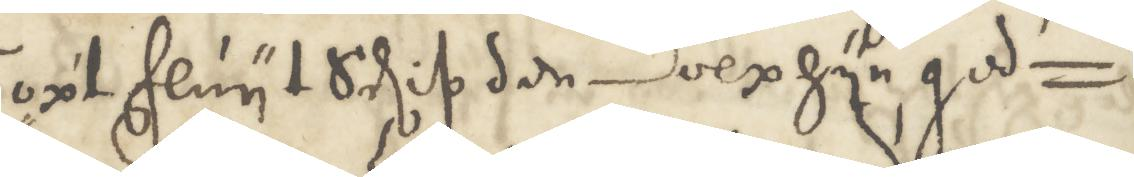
opt fluijt Schip den Dolphijn ged=e
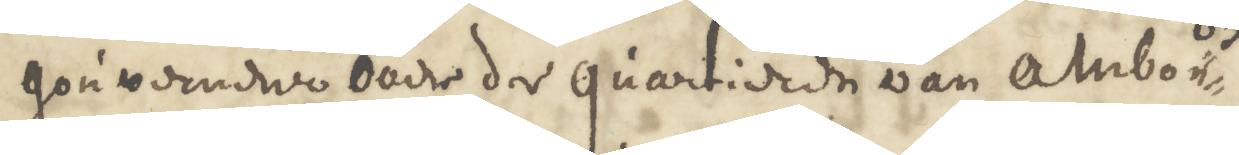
gouverneur over de quartieren van amboij„
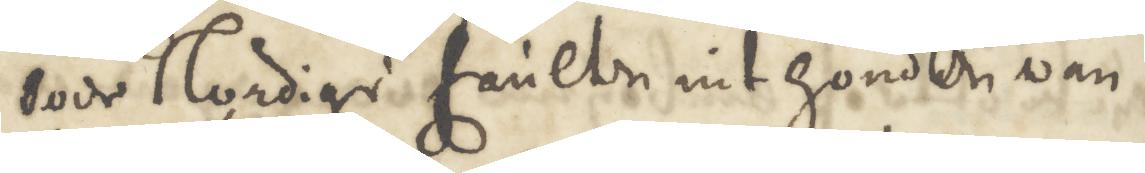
seer slordige faulten int houden van
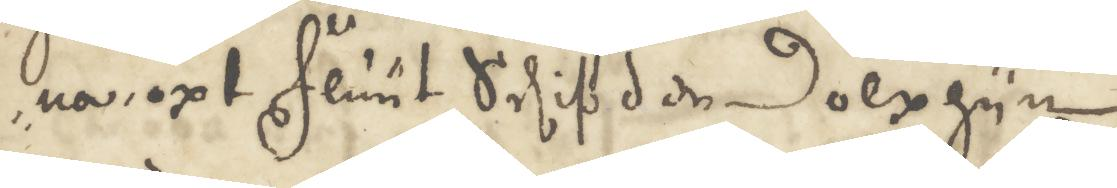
„na, op t fluijt Schip den Dolphijn
